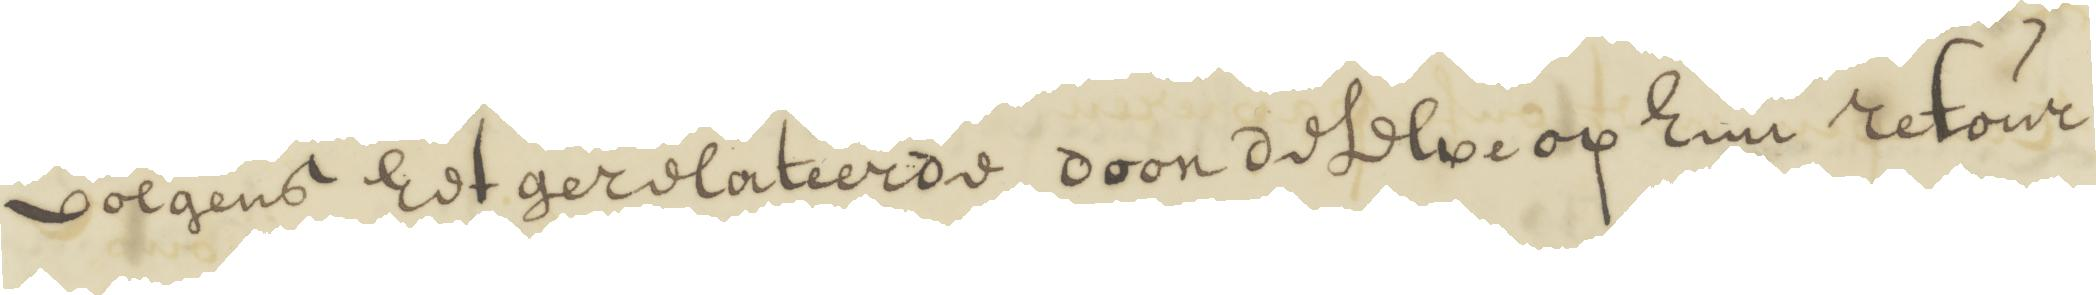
volgens het gerelateerde door deselve op hun retour
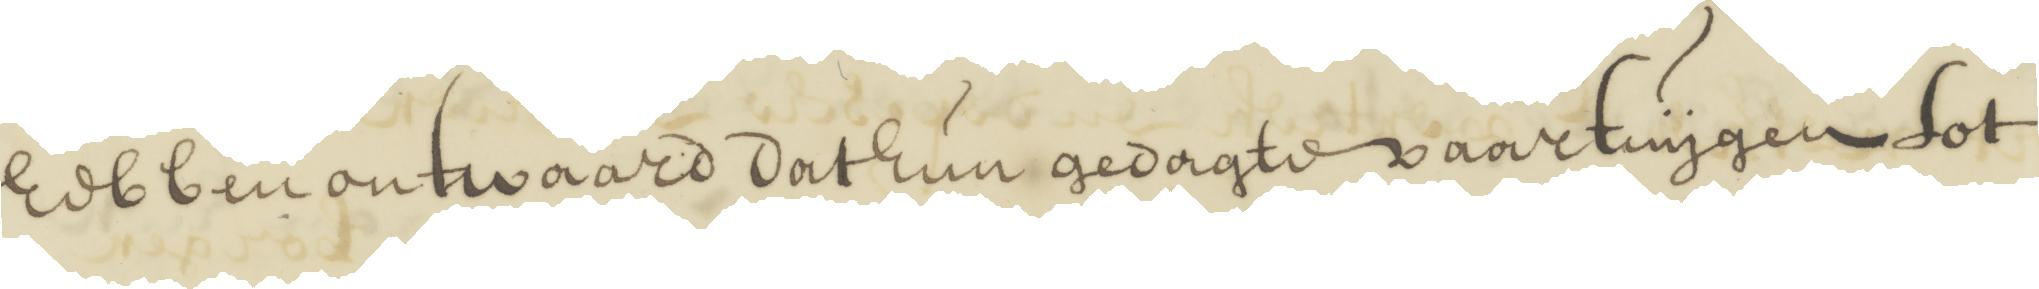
hebben ontwaard dat hun gedagte vaartuijgen tot
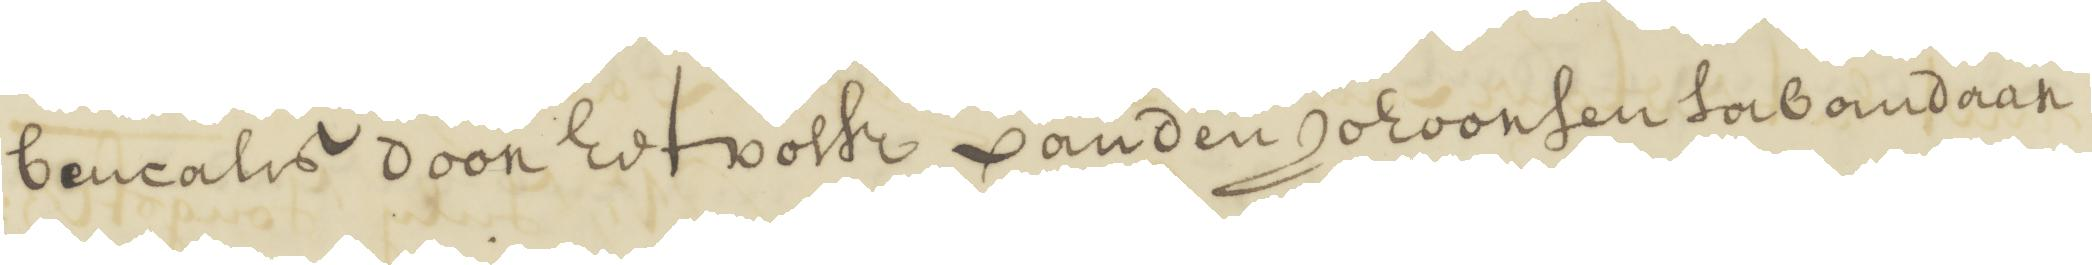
bencalis door het volk van den Johoorsen sabandaar
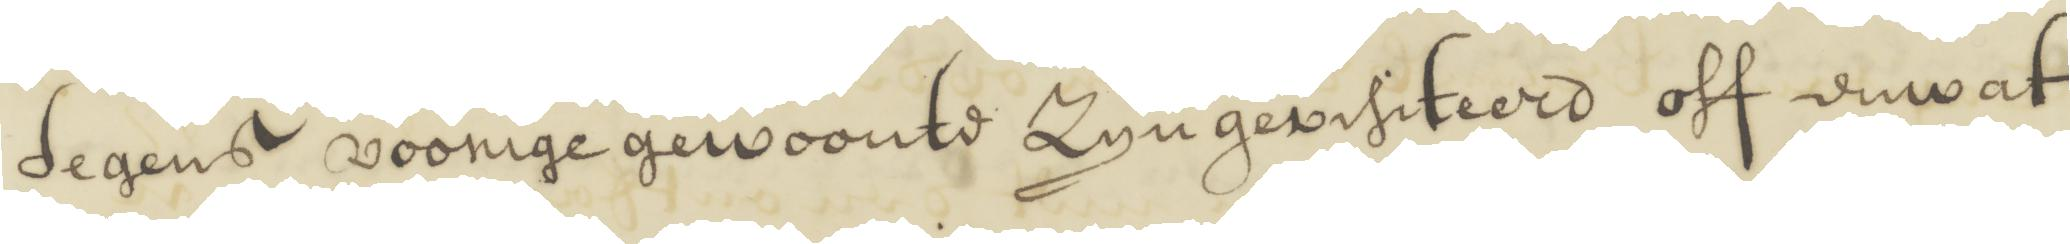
tegens voorige gewoonte Zyn gevisiteerd off enwat
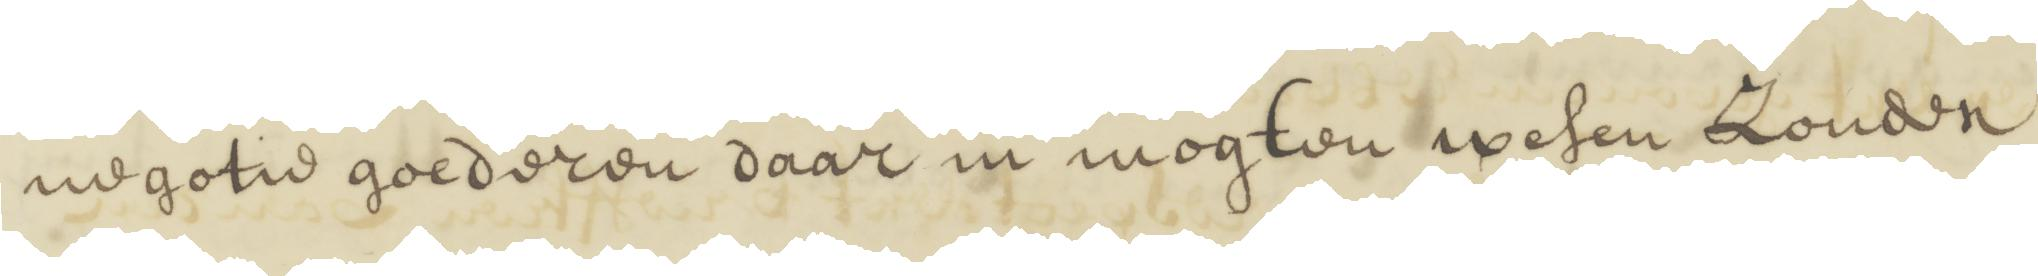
negotie goederen daar in mogten wesen Zonder
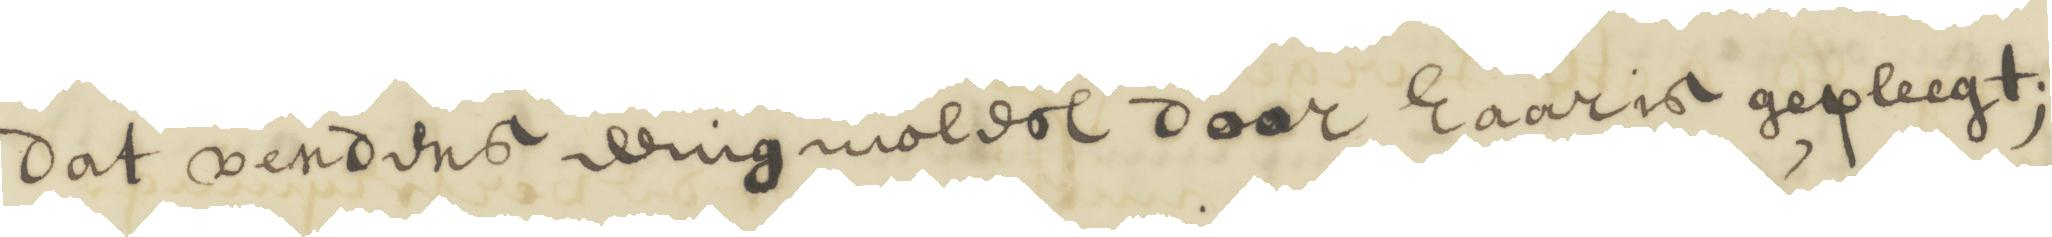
dat verders eenig molest door haar is gepleegt;
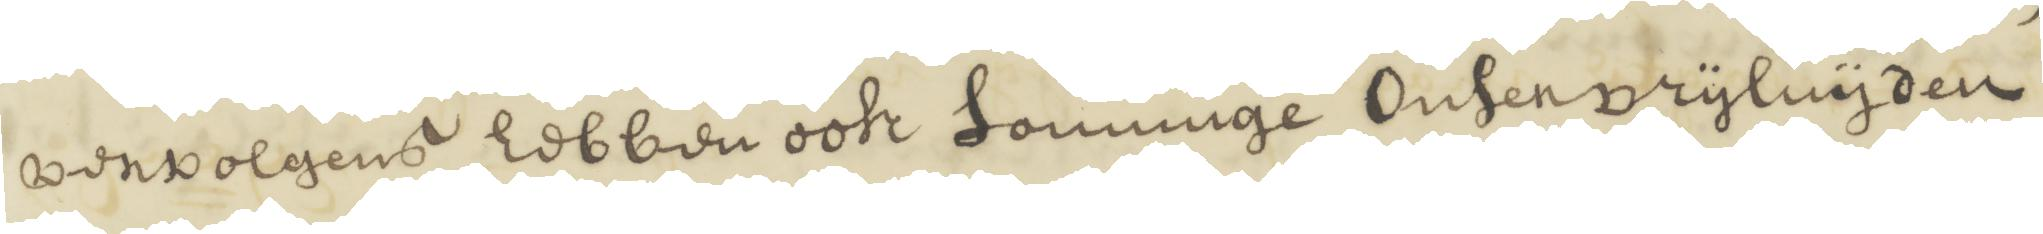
vervolgens hebben ook Sommige Onser vrijluijden
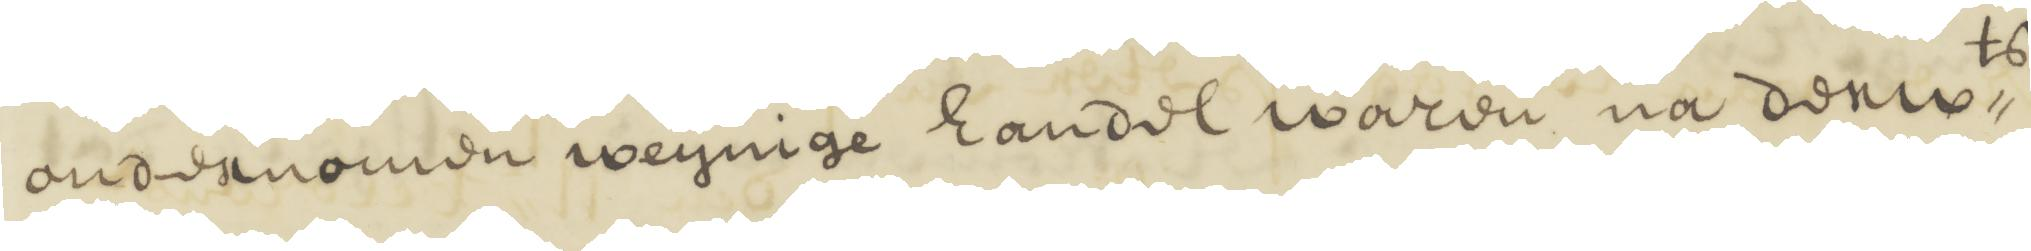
ondernomen weijnige handel waren na derw„ts
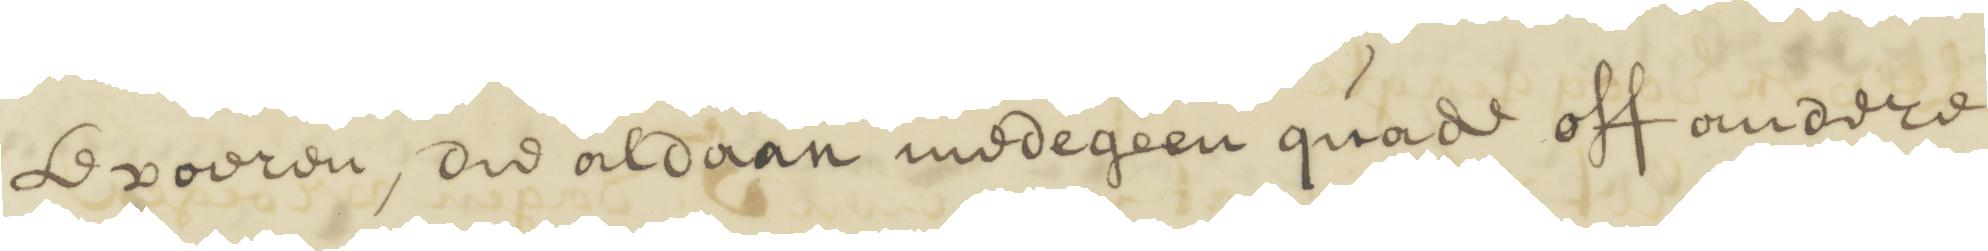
te voeren, die aldaar mede geen quade off andere
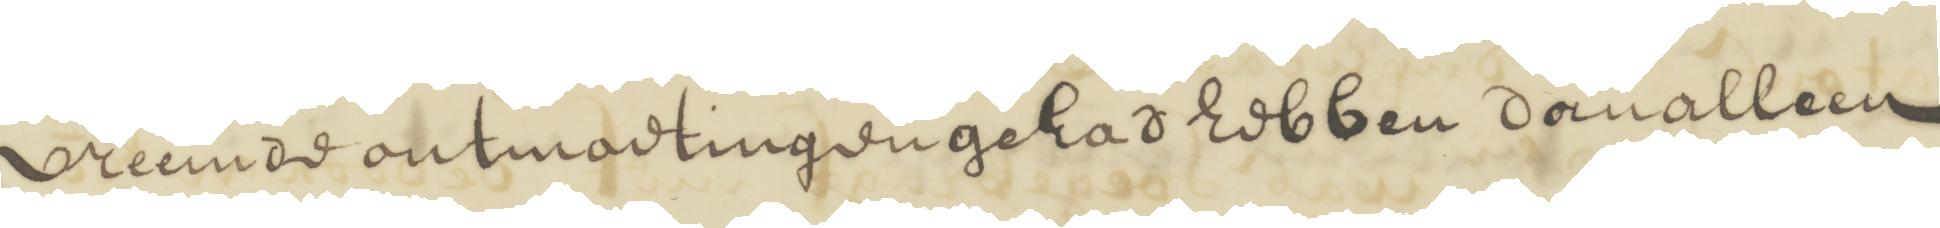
vreemde ontmoetingen gehad hebben dan alleen
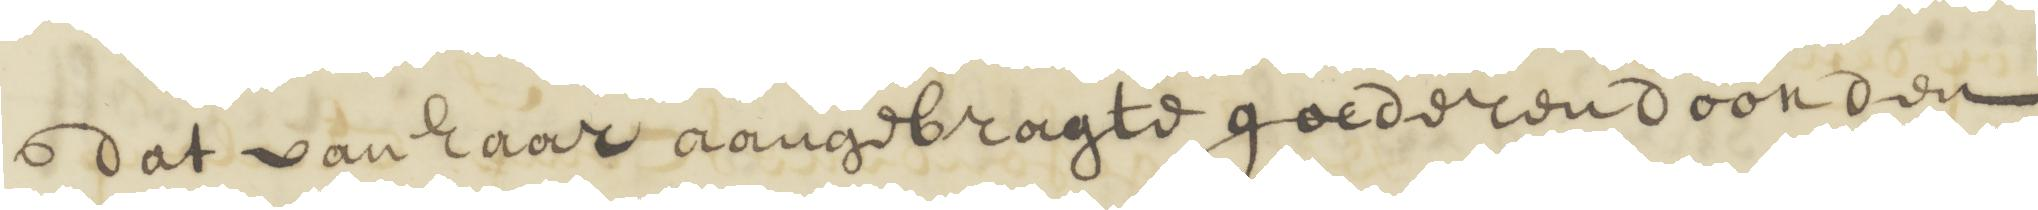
dat van haar aangebragte goederen door den
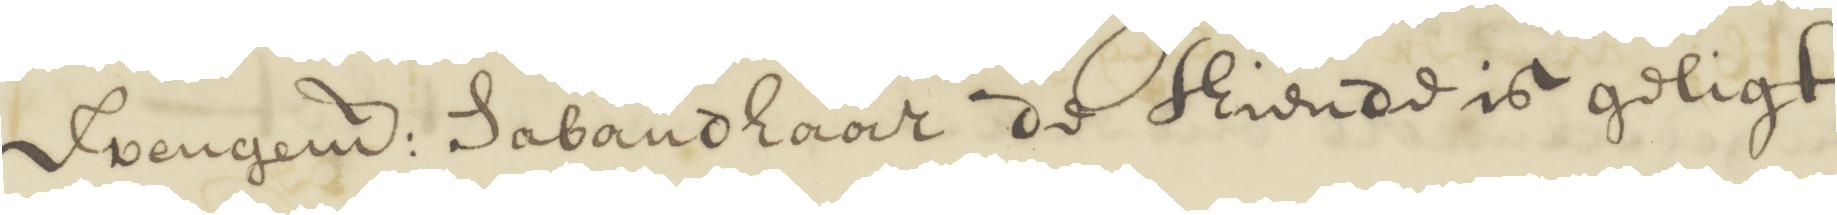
Evengem: Sabandhaar de thiende is geligt
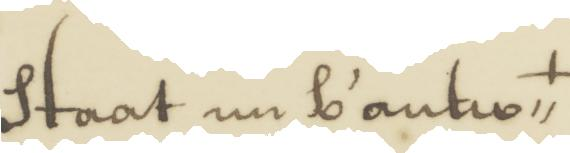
staat nu b' antw„t
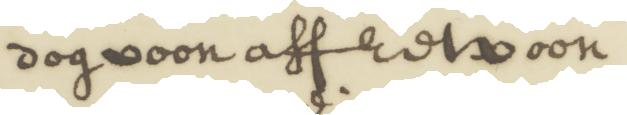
dog voor aff hetvoor
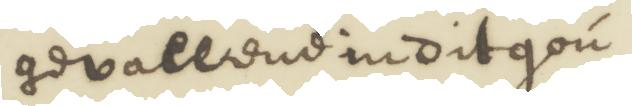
gevallene in dit gou
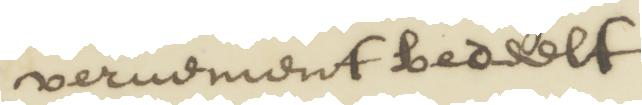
vernement bedeelt
